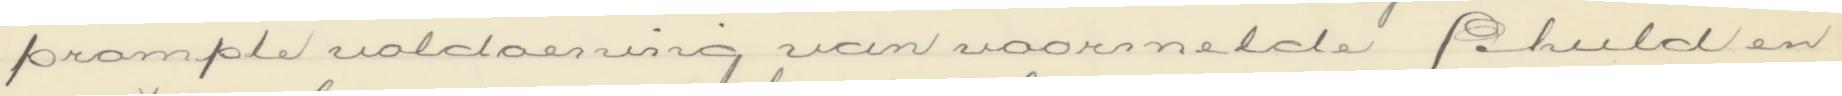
prompte voldoening, van voormelde schuld en
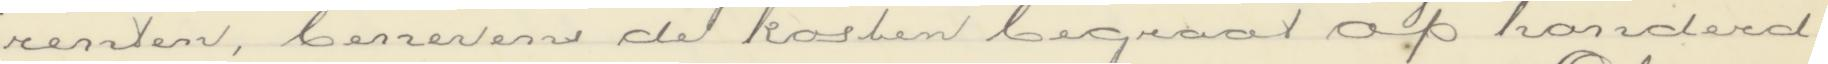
renten, benevens de kosten begroot op honderd.
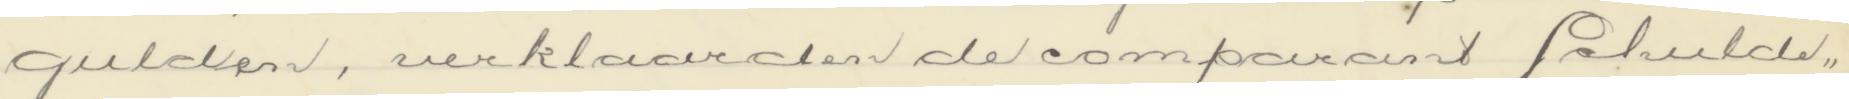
Gulden, verklaarden de comparant Schulde„
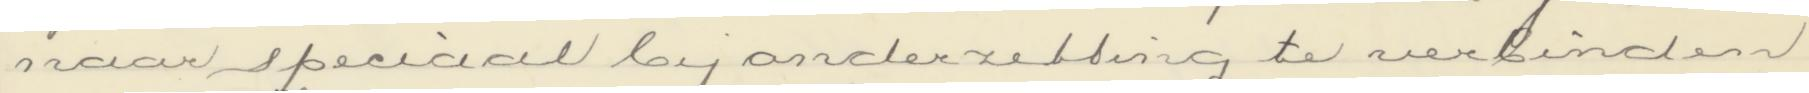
naar speciaal bij onderzetting te verbinden
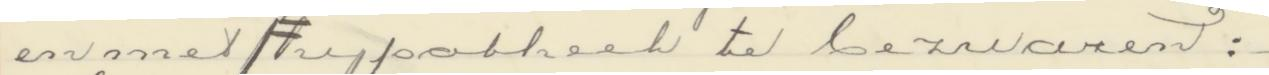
en met ¶hypotheek te bezwaren:
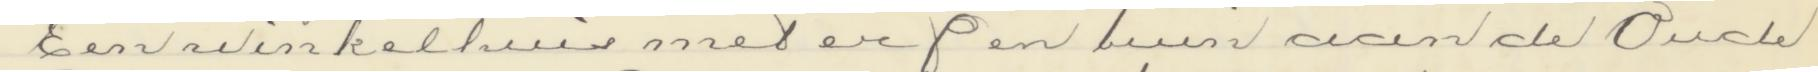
Een winkelhuis met erf en tuin aan de Oude
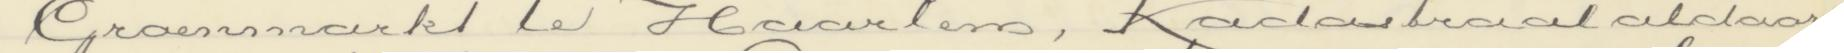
Groenmarkt te Haarlem, Kadastraal aldaar
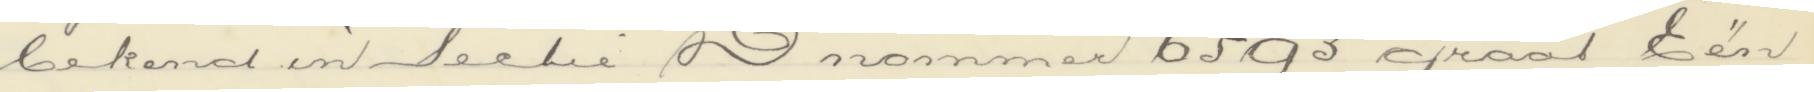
bekend in sectie D nommer 6593 groot Één
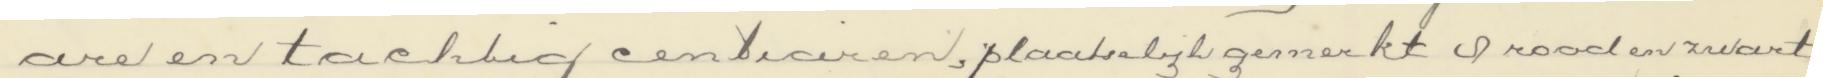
are en tachtig centiaren, plaatselijk gemerkt 8 rood en zwart
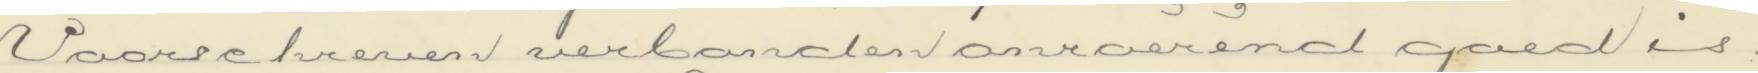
Voorschreven verbanden onroerendt goed is
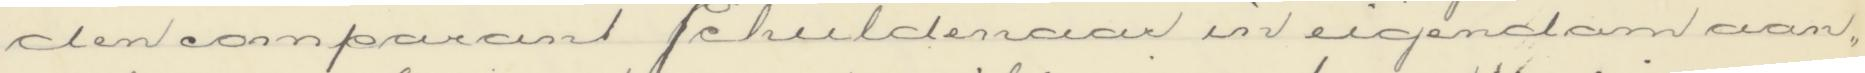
den comparant schuldenaar in eigendom aan„
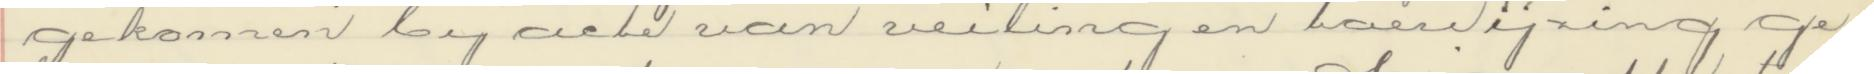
gekomen by acte van veiling en toewijzing ge
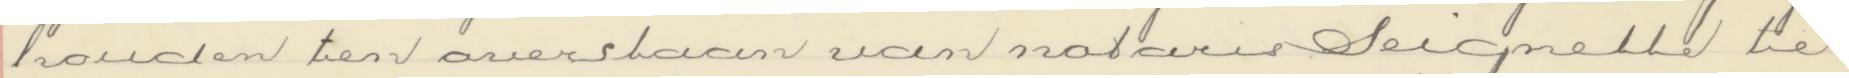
houden ten overstaan van notaris Seignette te
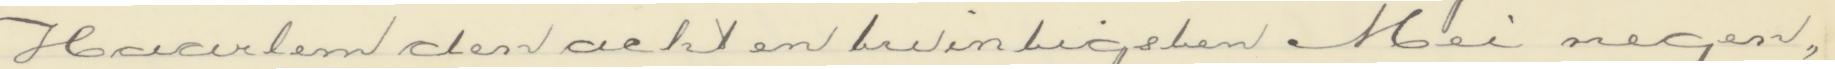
Haarlem den acht en twintigden Mei negen„
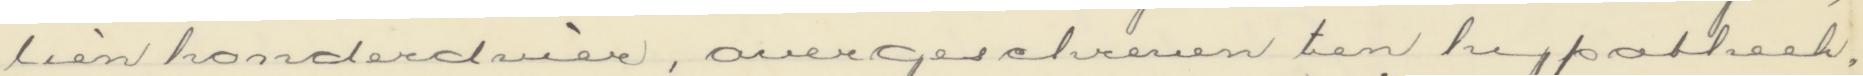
tien honderdvier, overgeschreven ten hypotheek„
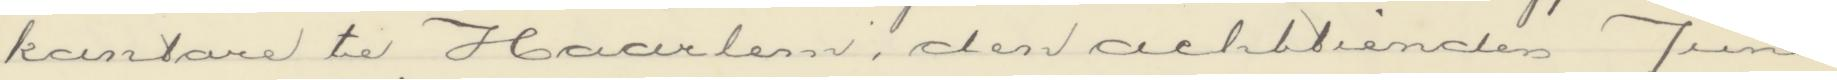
kantore te Haarlem, den achttienden Juni
